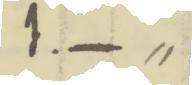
1. – „
